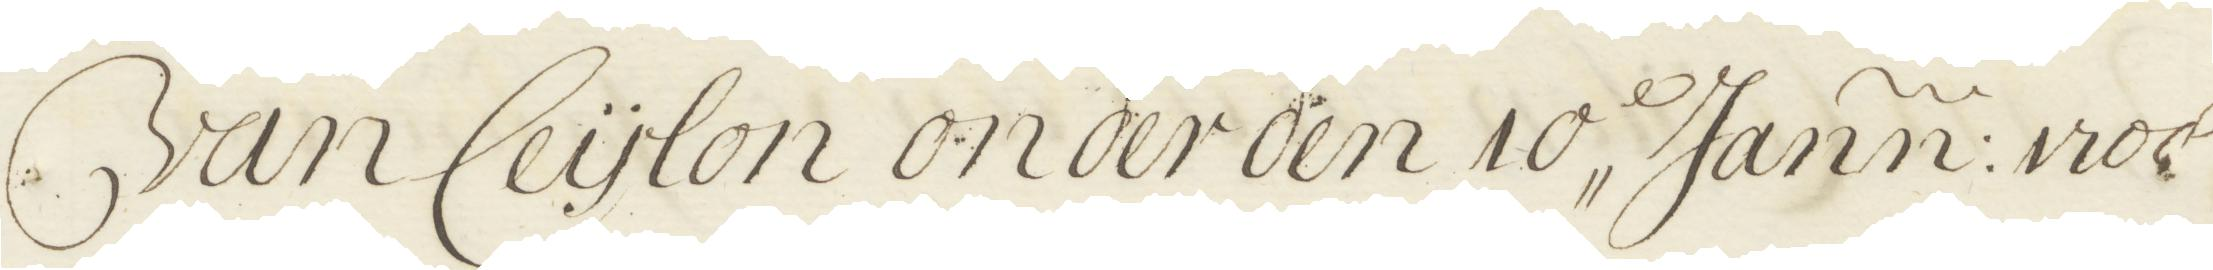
Van Ceijlon onder den 10„e Jann: 1708
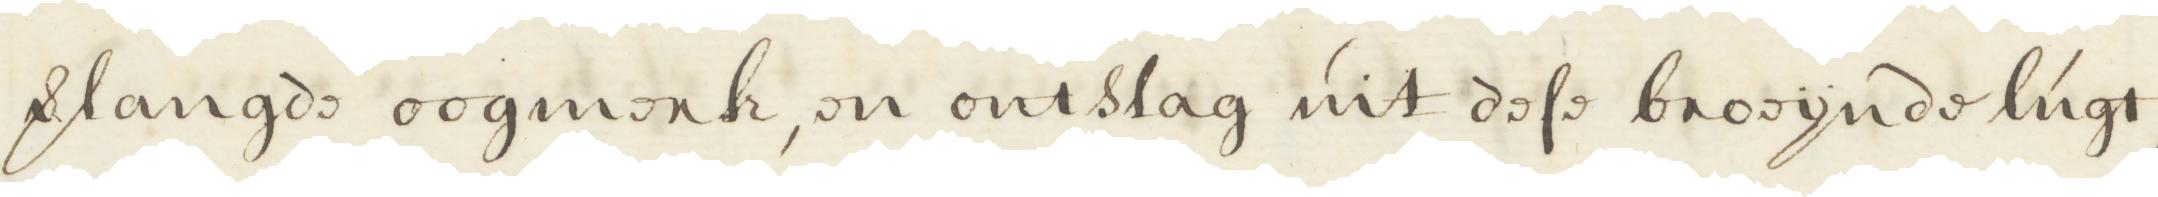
verlangde oogmerk, en ontslag uit dese broeijnde lugt
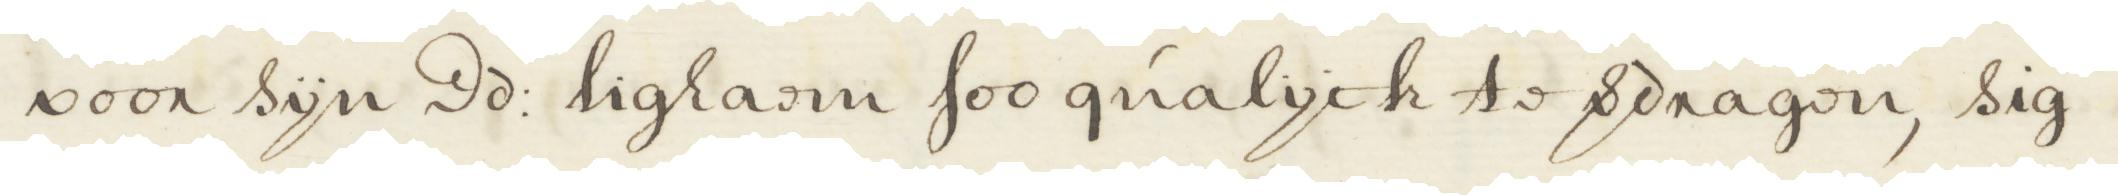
voor sijn Ed: lighaem soo qualijck te verdragen, sig
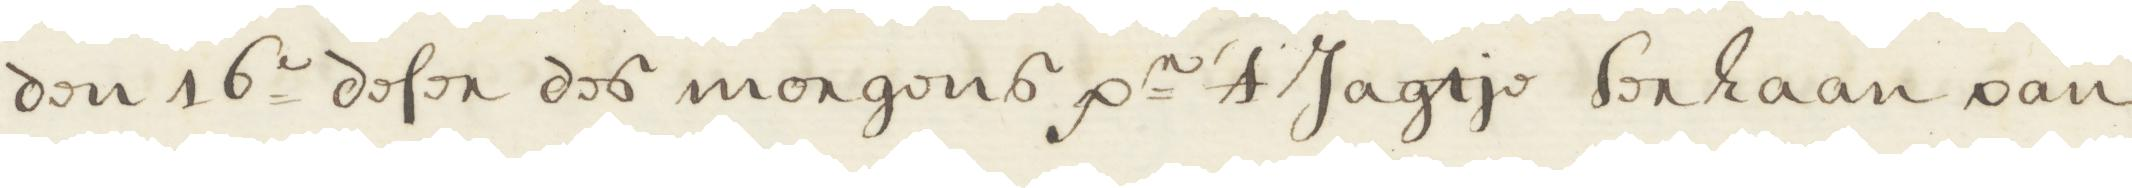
den 16=e deser des morgens p=r ’t Jagtje terhaar van
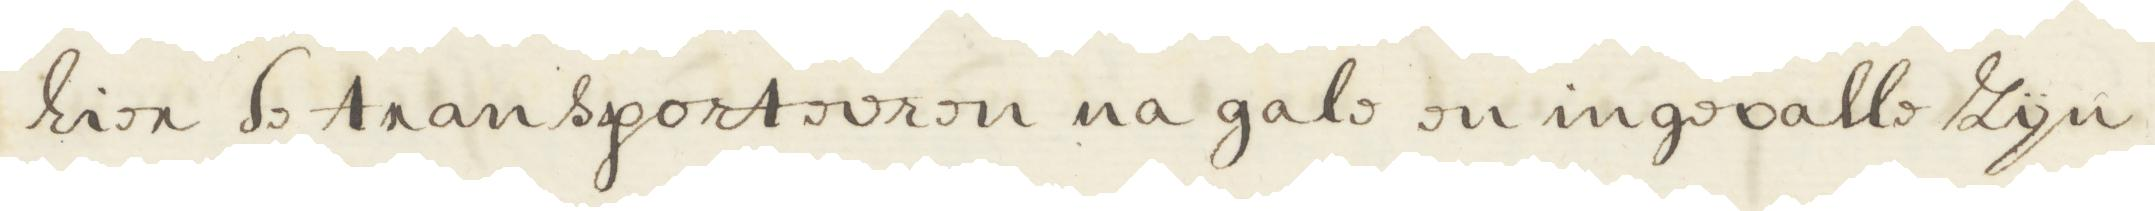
hier te transporteeren na gale en ingevalle zijn
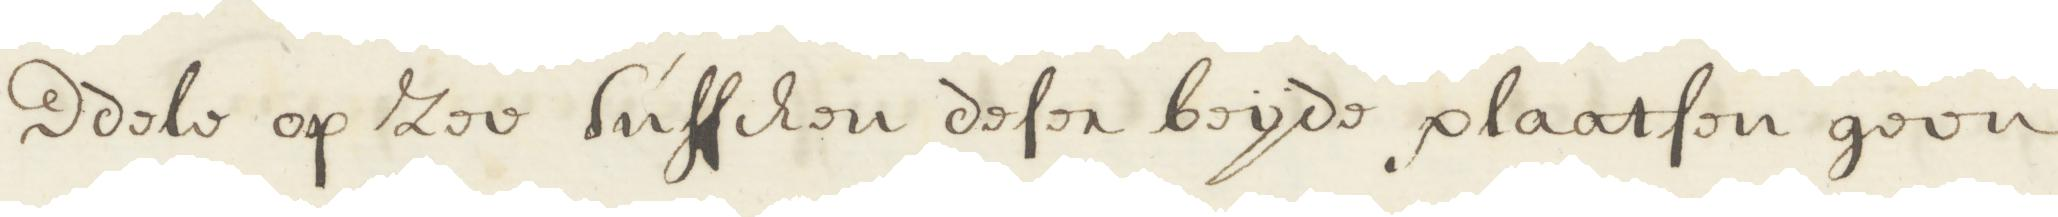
Edele op zee tusschen deser beijde plaatsen geen
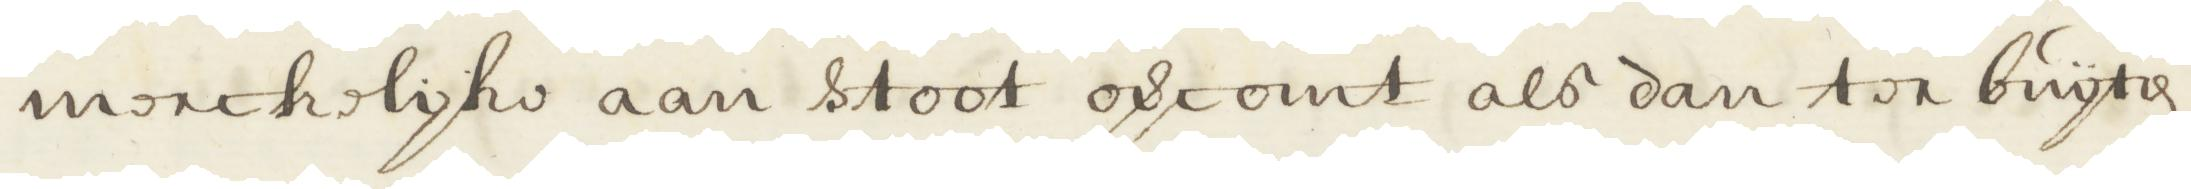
merckelijke aan stoot overcomt als dan ter buijten
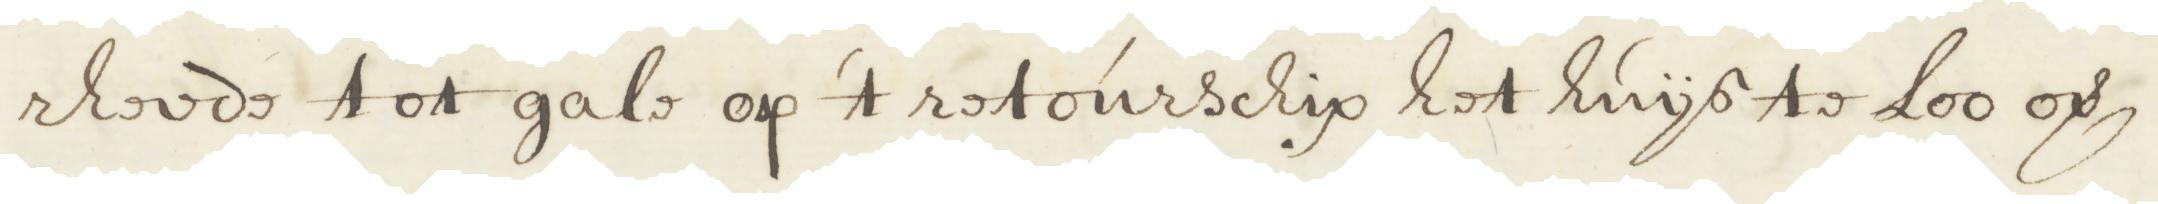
rheede tot gale op ’t retourschip het huijs te Loo over
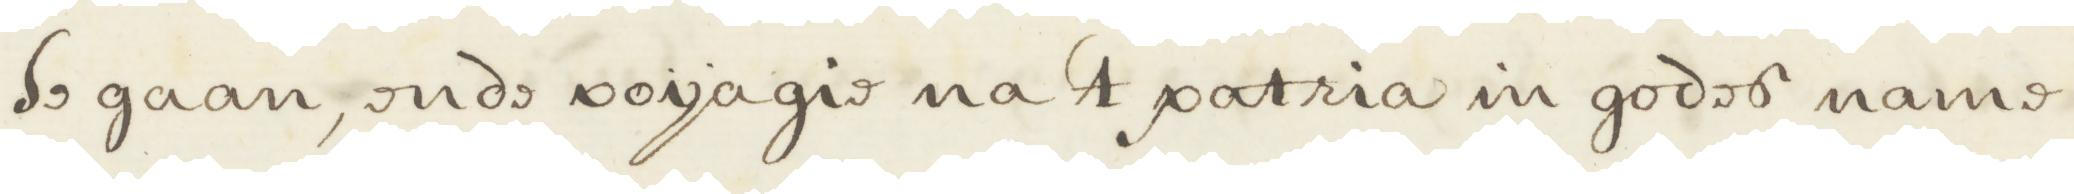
te gaan, en de voijagie na ’t patria in godes name
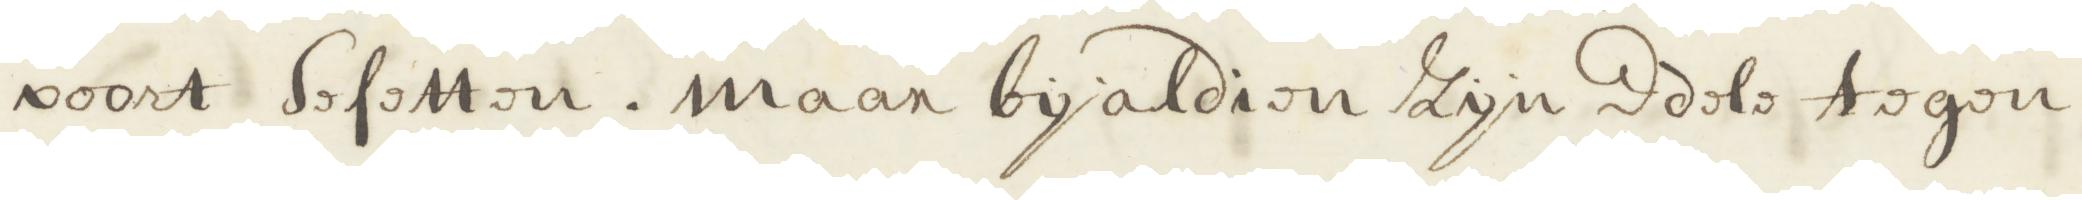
voort te setten. Maar bij aldien zijn Edele tegen
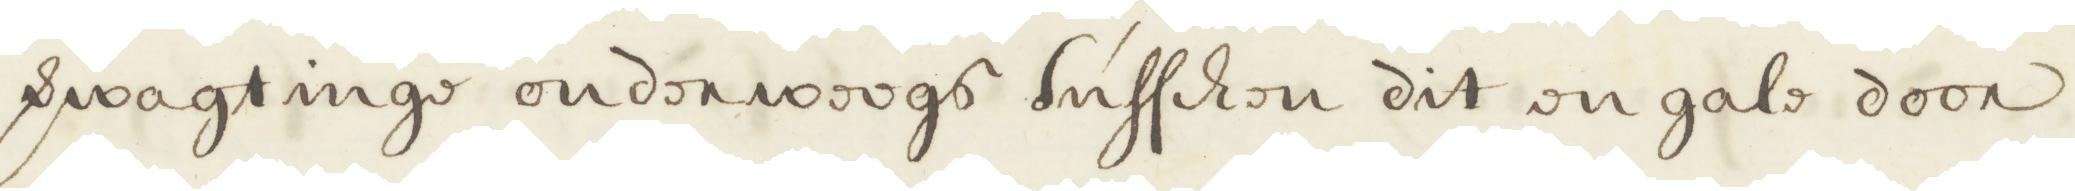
verwagtinge onderweegs tusschen dit en gale door
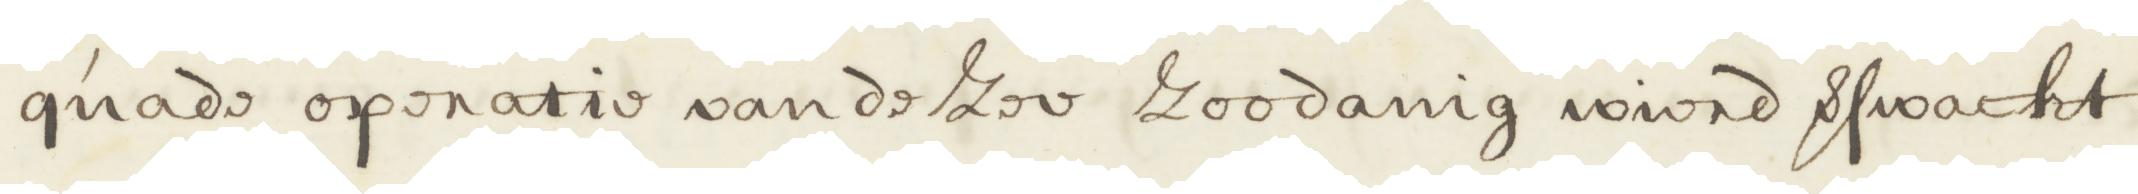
quade operatie van de zee zoodanig wierd verswackt
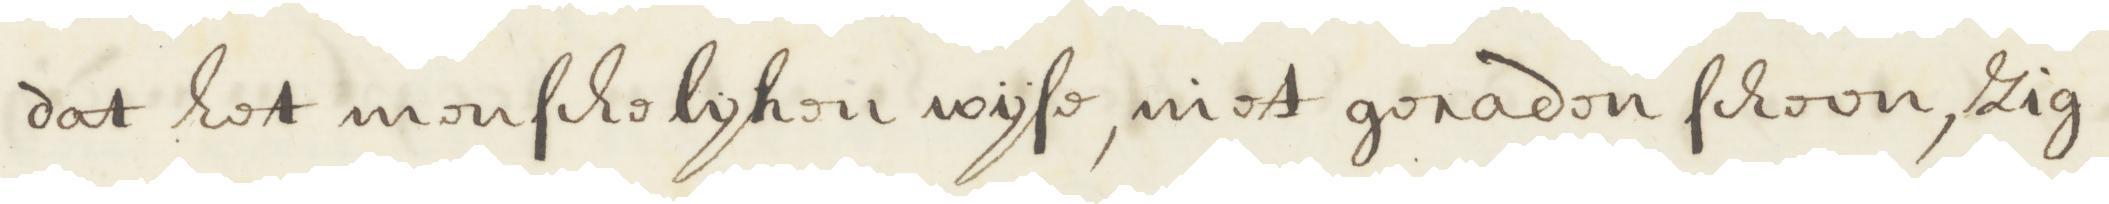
dat het menschelijken wijse, niet geraden scheen, zig
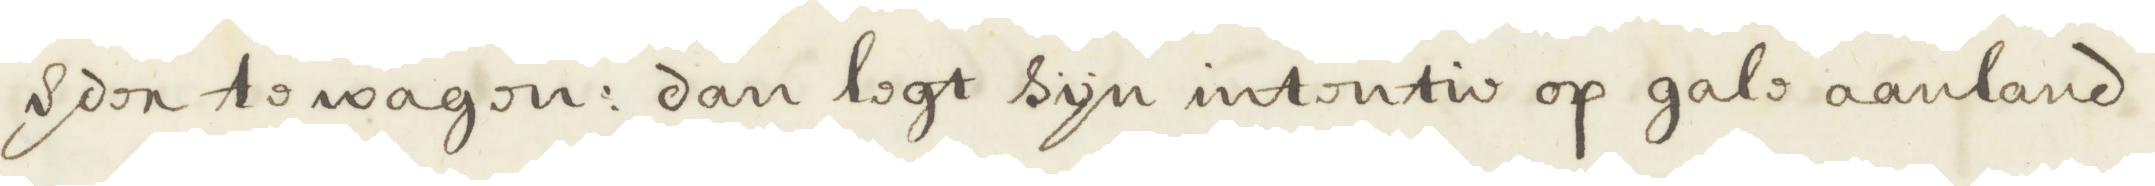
verder te wagen: dan legt sijn intentie op gale aanland
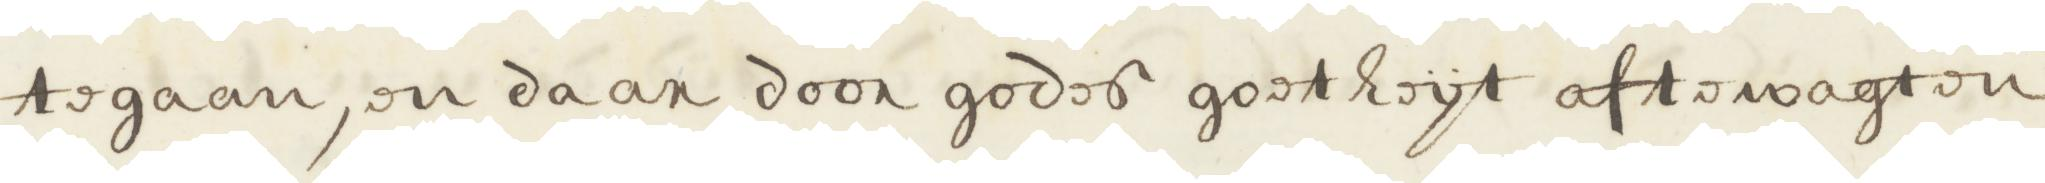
te gaan, en daar door godes goetheijt afte wagten
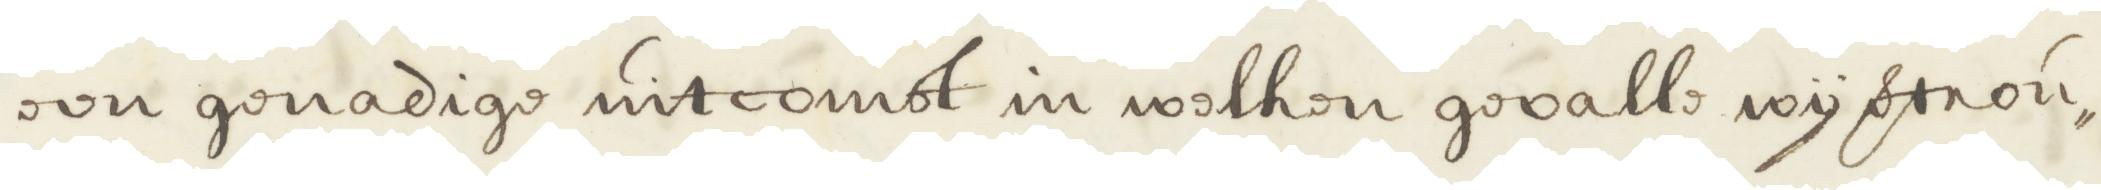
een genadige uitcomst in welken gevalle wij vertrou„
